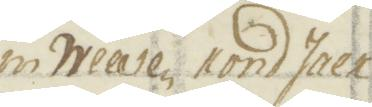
in weersen rond Jaer
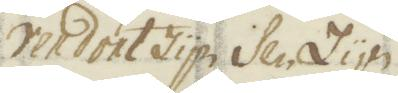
verdort zijn sen zijn
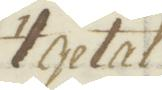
't getal
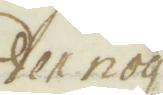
der nog
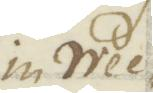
in wee
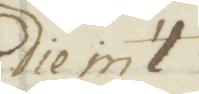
die in ’t
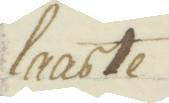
laaste
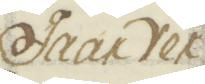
Jaar ver
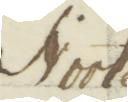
Noote
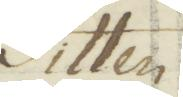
Pitten
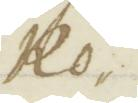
Ko„
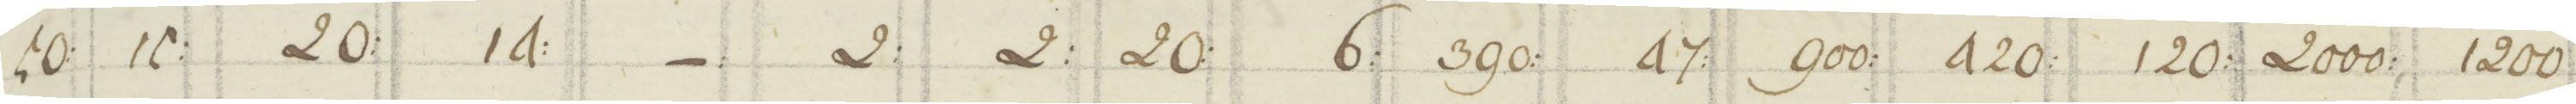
50 15: 20: 14: _: 2: 2: 20: 6: 390: 47: 900: 420: 120: 2000: 1200
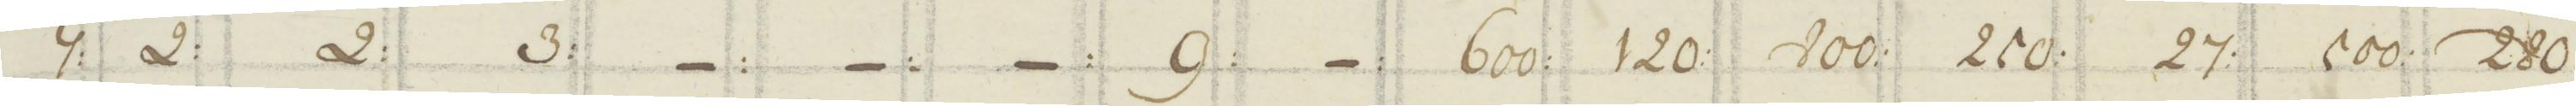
7: 2: 2: 3: _: _: _: 9: _: 600: 120: 800: 250: 27: 500: 280
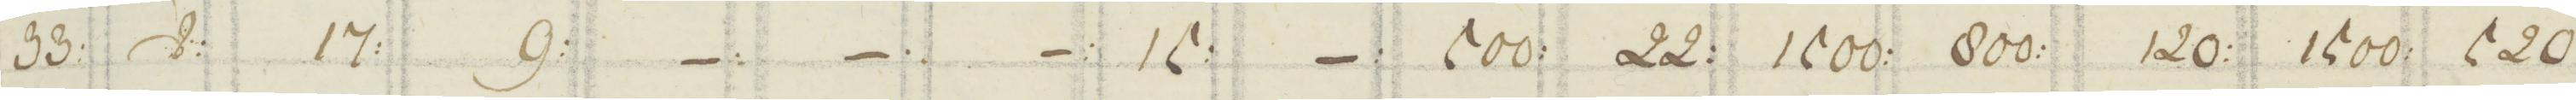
33: 8: 17: 9: _: _: _: 15: _: 500: 22: 1500: 800: 120: 1500: 520
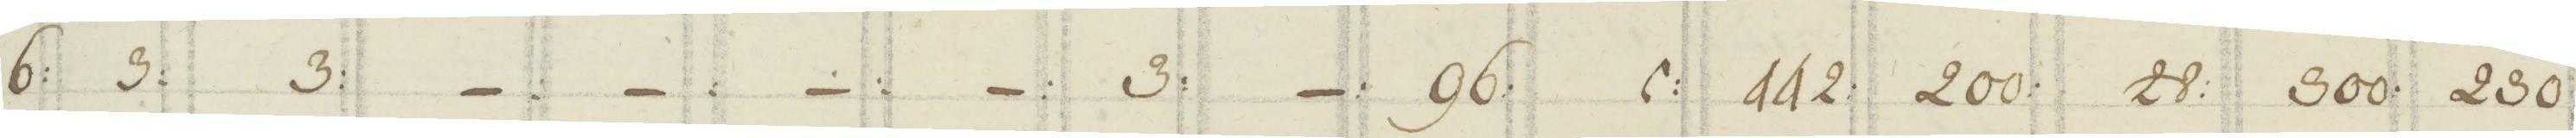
6: 3: 3: _: _: _: _: 3: _: 96: 5: 442: 200: 28: 300: 230
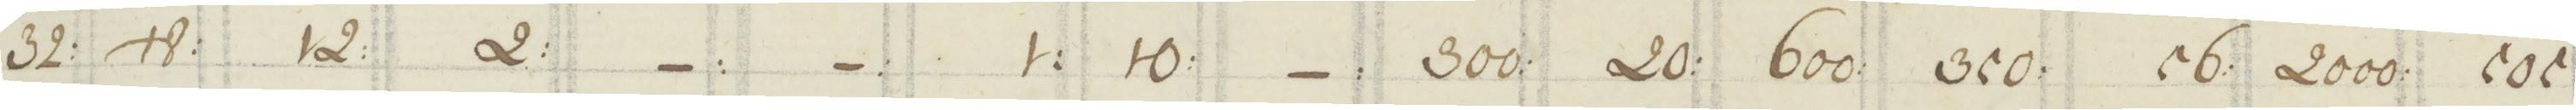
32: 18: 12: 2: _: _: 1: 10: _: 300: 20: 600: 350: 56: 2000: 505
